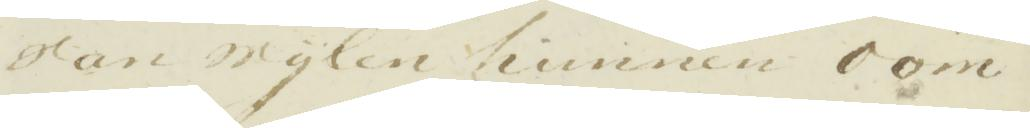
van wijlen hunnen oom
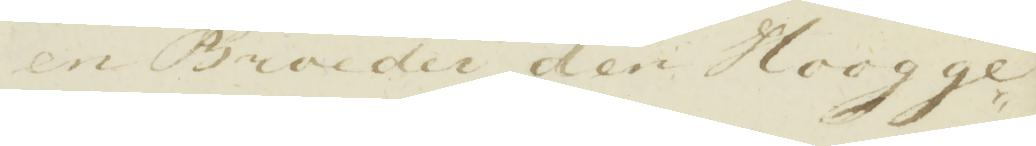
en Broeder den Hoogge„
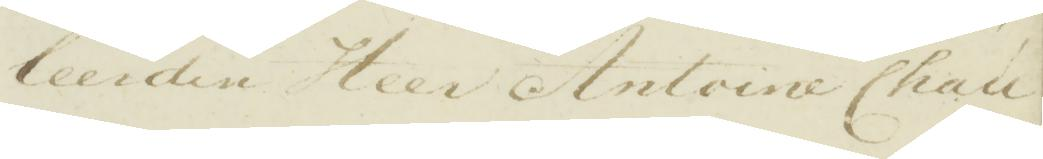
leerden Heer Antoine Chau
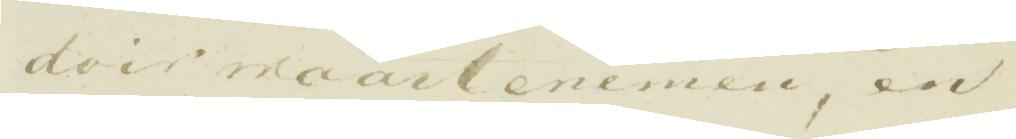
doir waartenemen, en
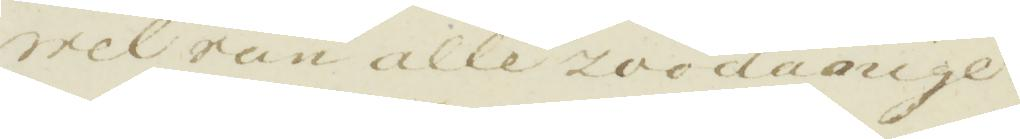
wel van alle zoodaanige
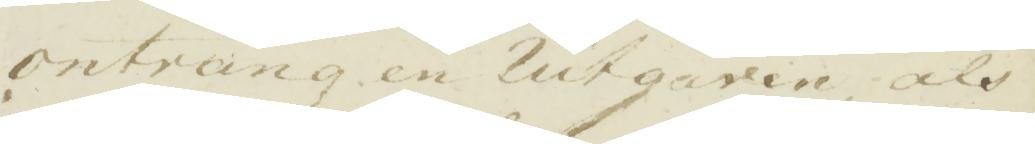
ontvang en uitgaven, als
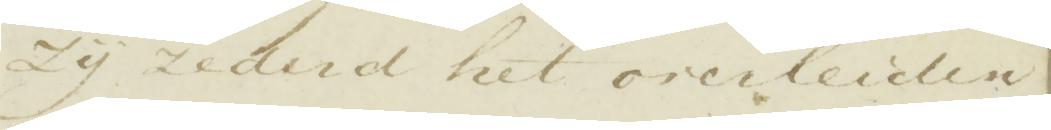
zij zederd het overleiden
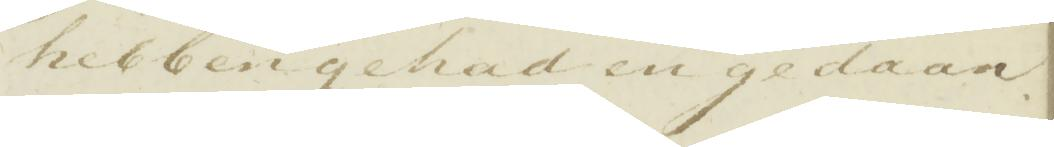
hebben gehad en gedaan.
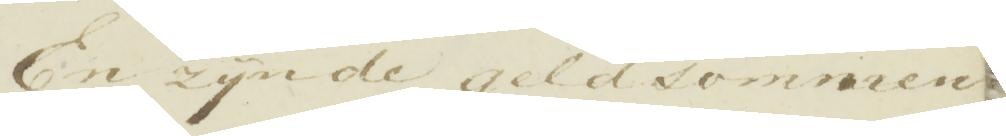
En zijn de geld sommen
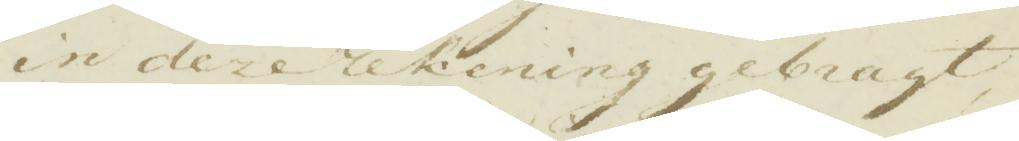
in deze rekening gebragt,
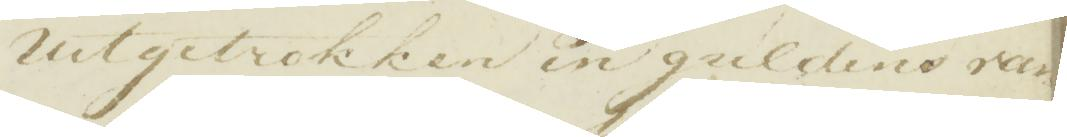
uitgetrokken in guldens van
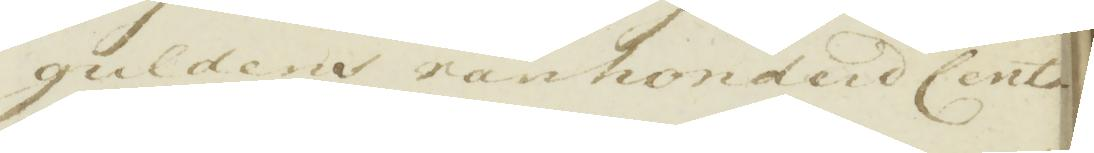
guldens van honderd Cent
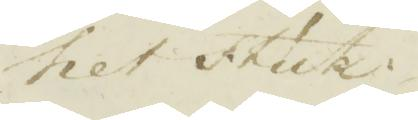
het stuk:
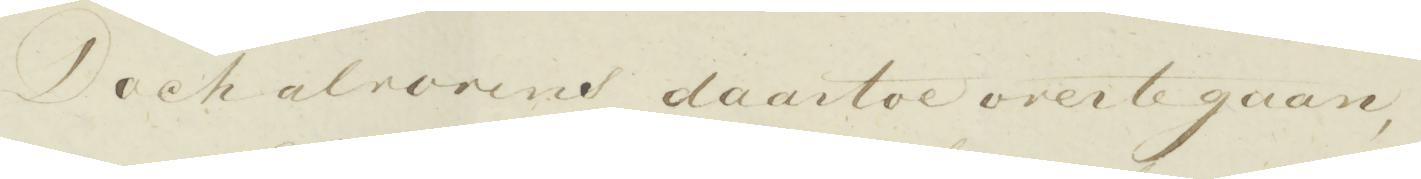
Doch alvorens daartoe over te gaan,
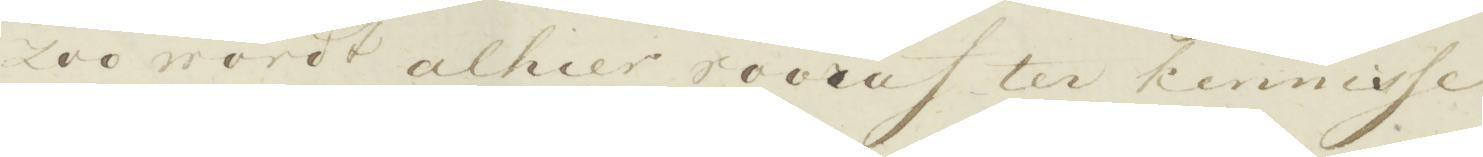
zoo wordt alhier vooraf ter kennisse
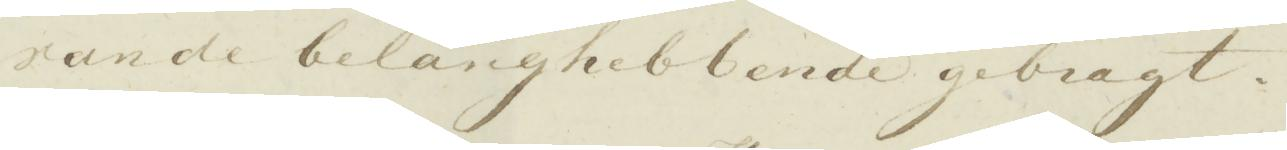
van de belanghebbende gebragt.
